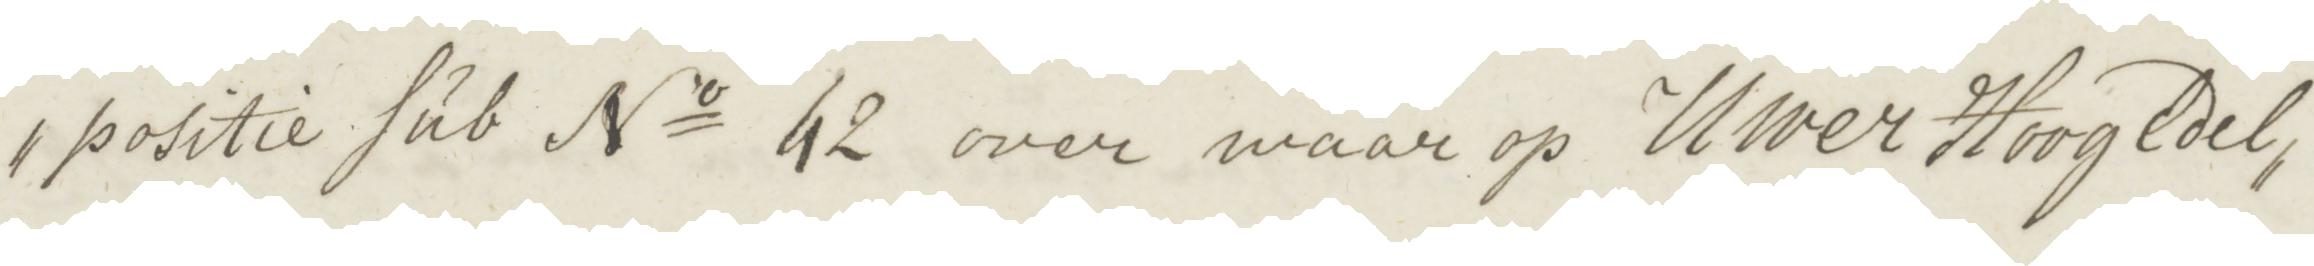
„positie sub N=o 42 over waar op Uwer Hoog Edel„
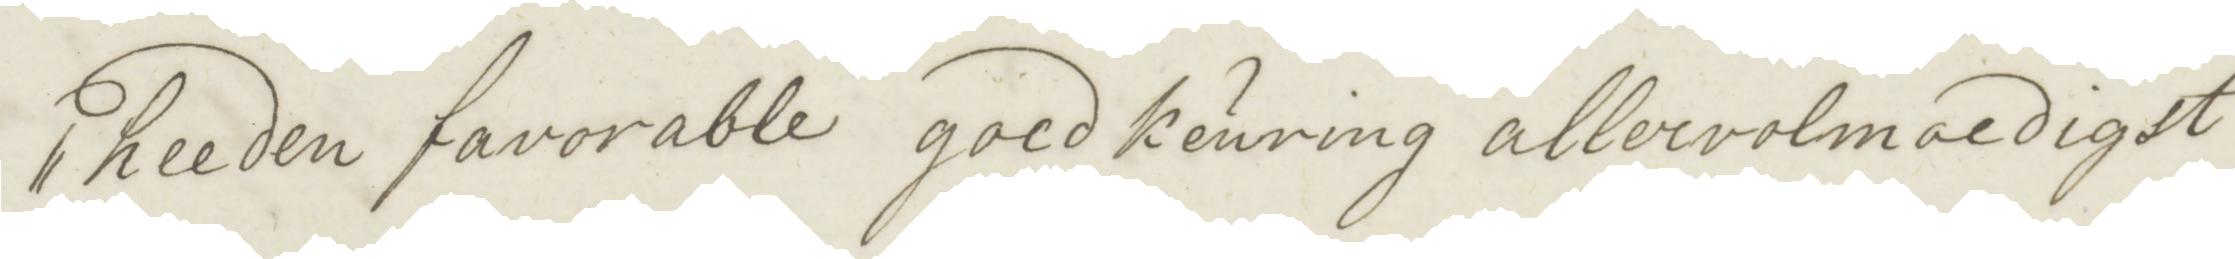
„heeden favorable goed keuring allervolmoedigst
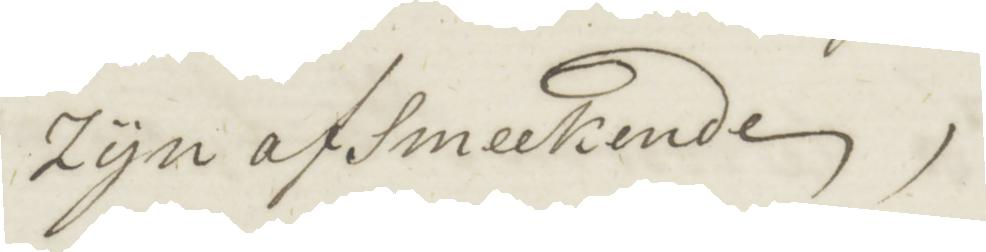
zijn afsmeekende,
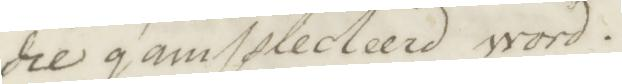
die g'amplecteerd word.
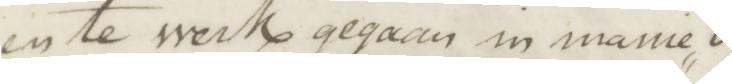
en te werk gegaan in manie„
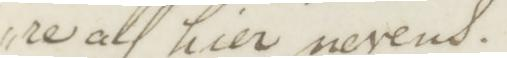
„re alshier nevens.
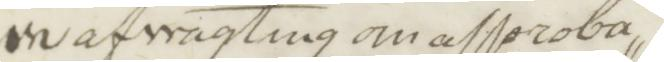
in afwagting om approba„
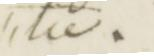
„tie.
